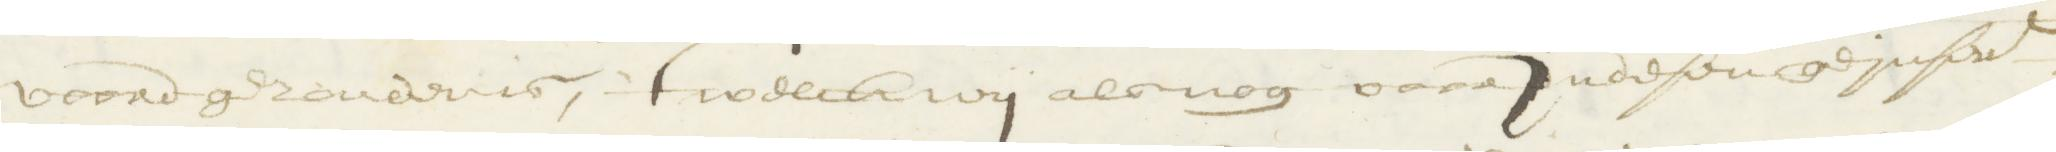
voord gezonden is, ’t welck wij als nog voor Jndesen gejnsr.t
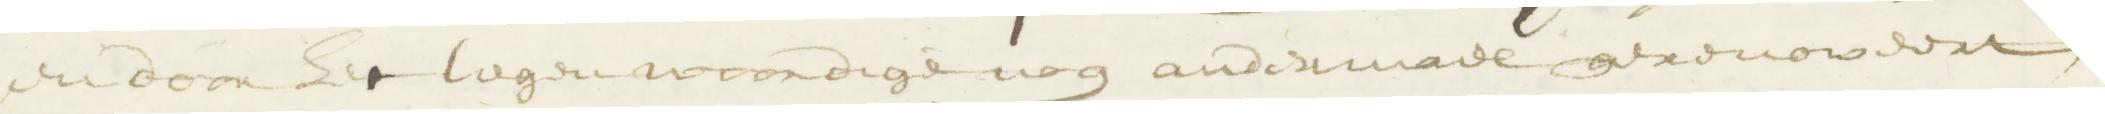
en door het tegenwoordige nog andermael gerenoveert
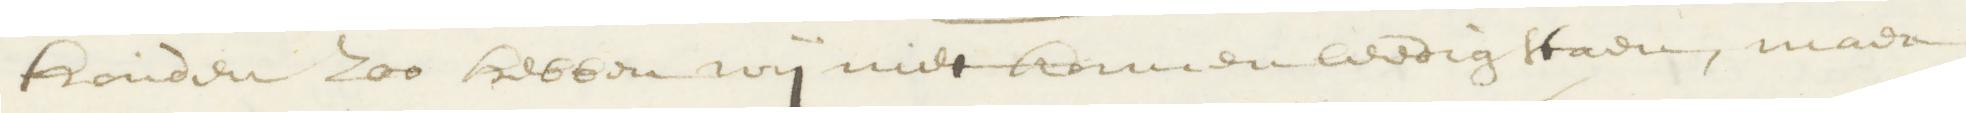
houden zoo hebben wij niet konnen leedigstaen, maer
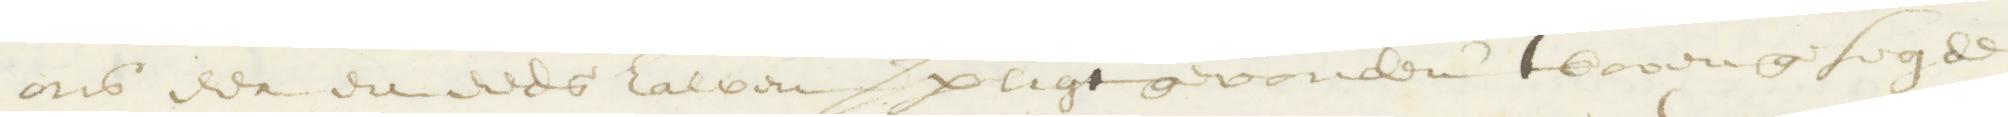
ons eer en eeds halven verpligt gevonden 't boven gesegde
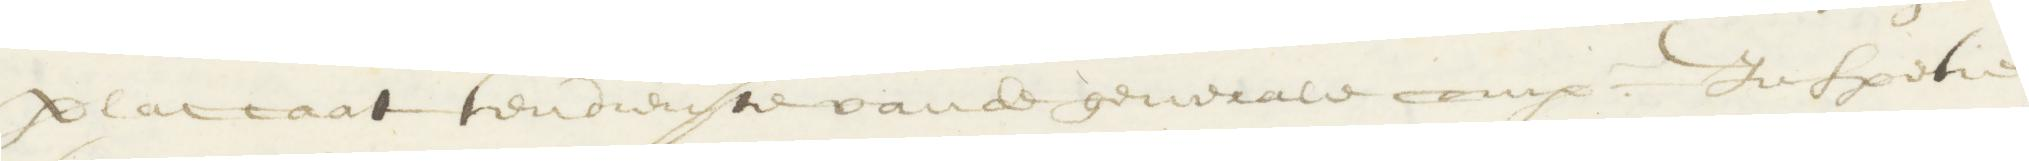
placcaat ten dienste vande generale comp:' In spetie
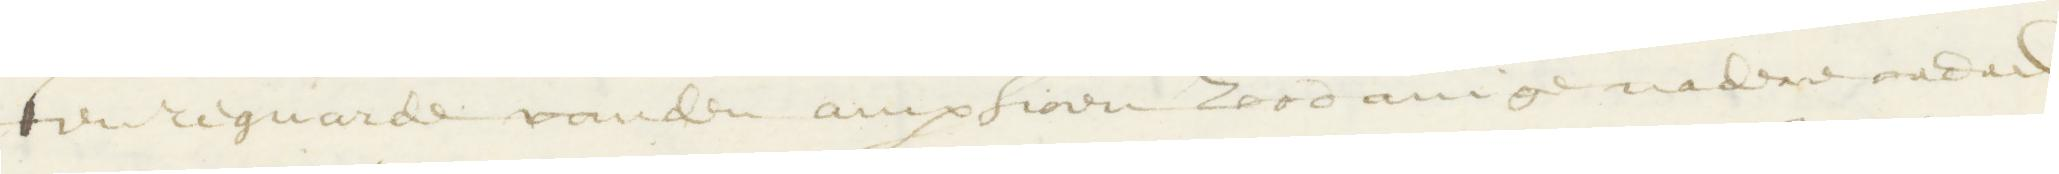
ten reguarde vanden amphioen zoodanige nadere ordre
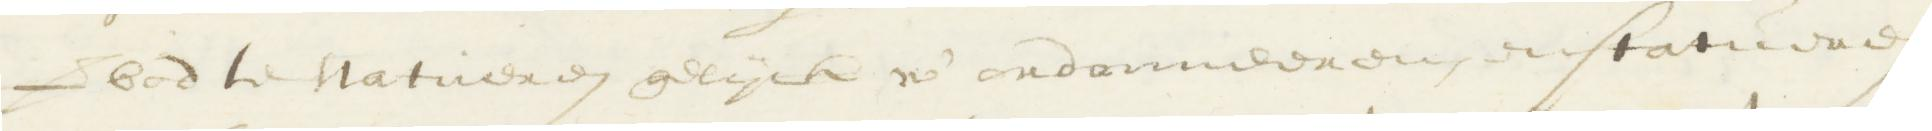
en verbod te statueren gelijck r' ordonneeren, en statueren
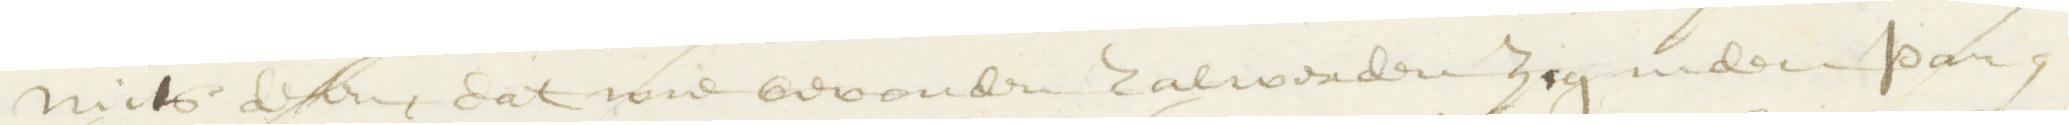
mits desen, dat wie bevonden zal werden zig inden par
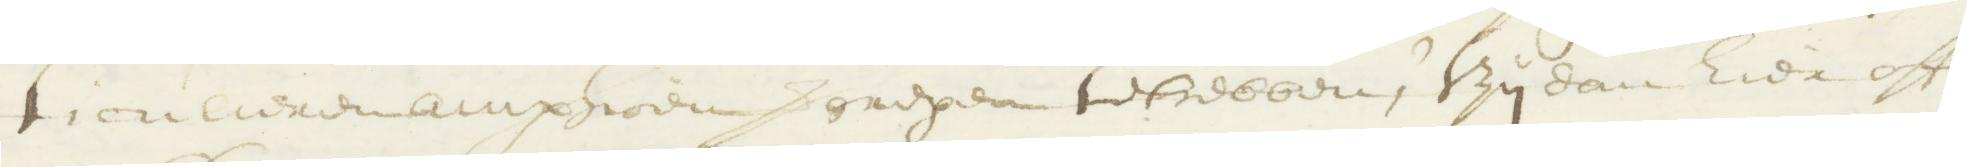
ticulieren amphioen vergrepen te hebben, 'tzij dan hier off
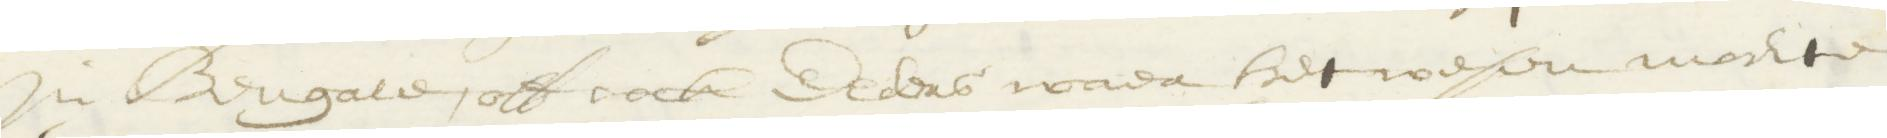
jn Bengale, offf oock Elders waer het wesen mochte
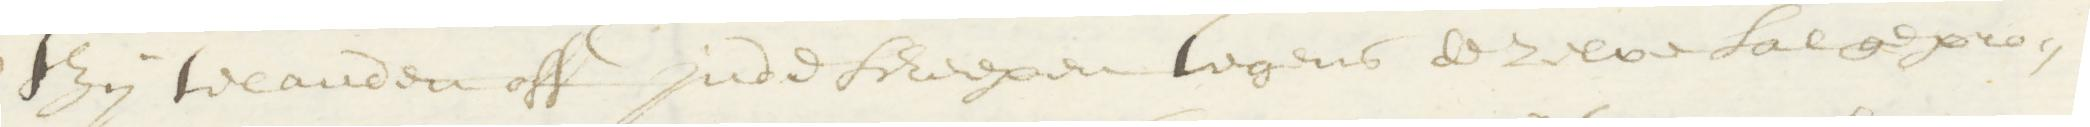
'tzij telanden off' jnde scheepen tegens de zelve sal gepro„
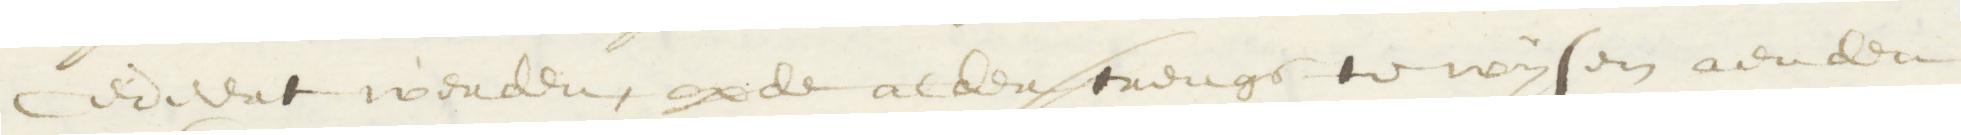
cedeert werden, opde alderstrengste wijsen aenden
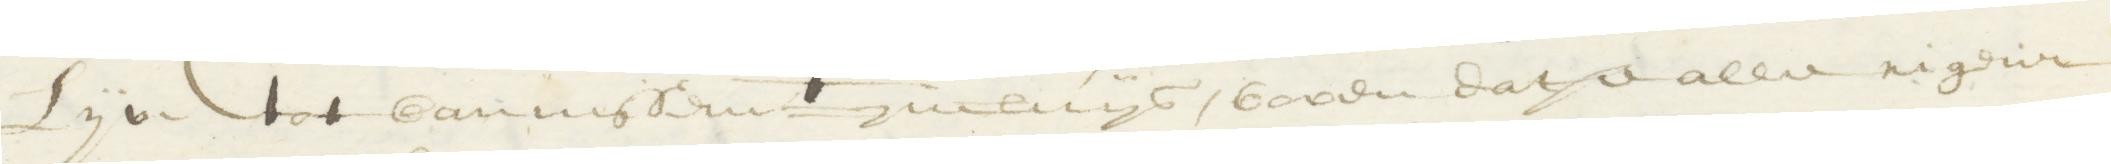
Lijve tot bannisem=t jncluijs, boven datse alle rigeur
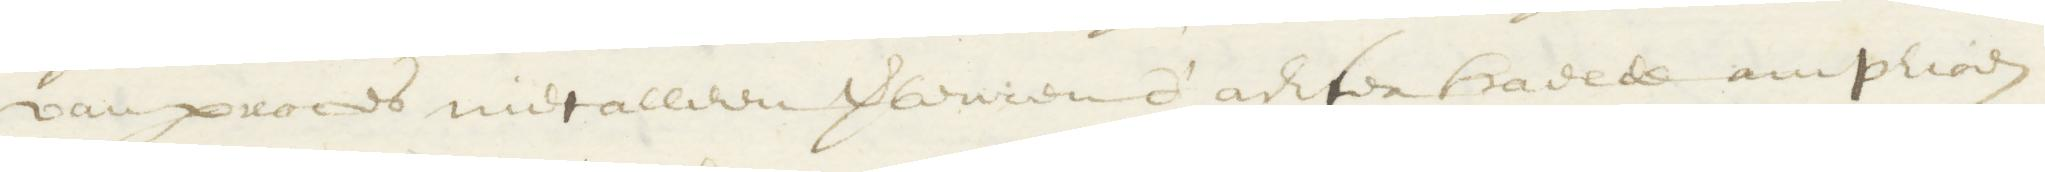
van proces niet alleen verbeuren d' achterhaelde amphioen
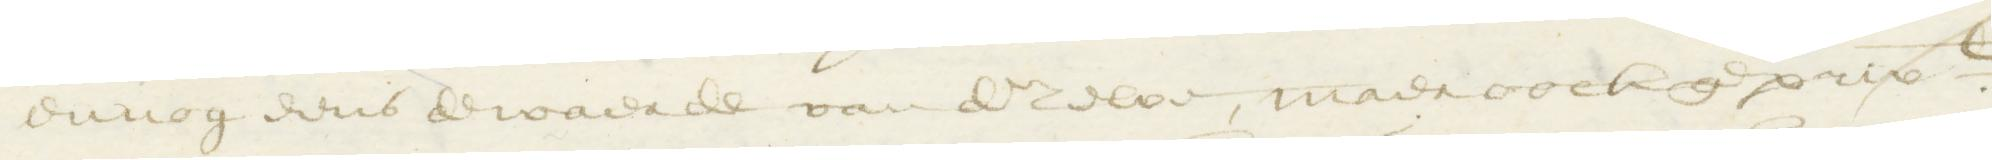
ennog eens de waerde van dezelve, maer oock gepriv.t
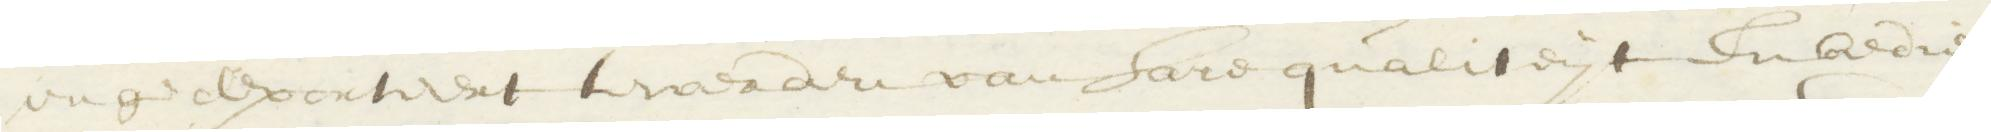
en gedeporteert tewerden van hare qualiteijt En bedie
